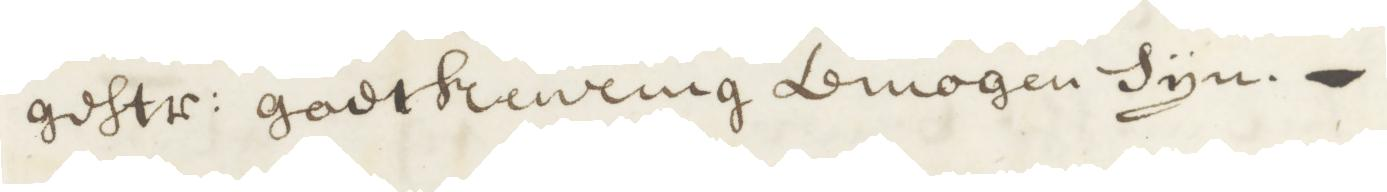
gestr: goetkeuring te mogen sijn.—
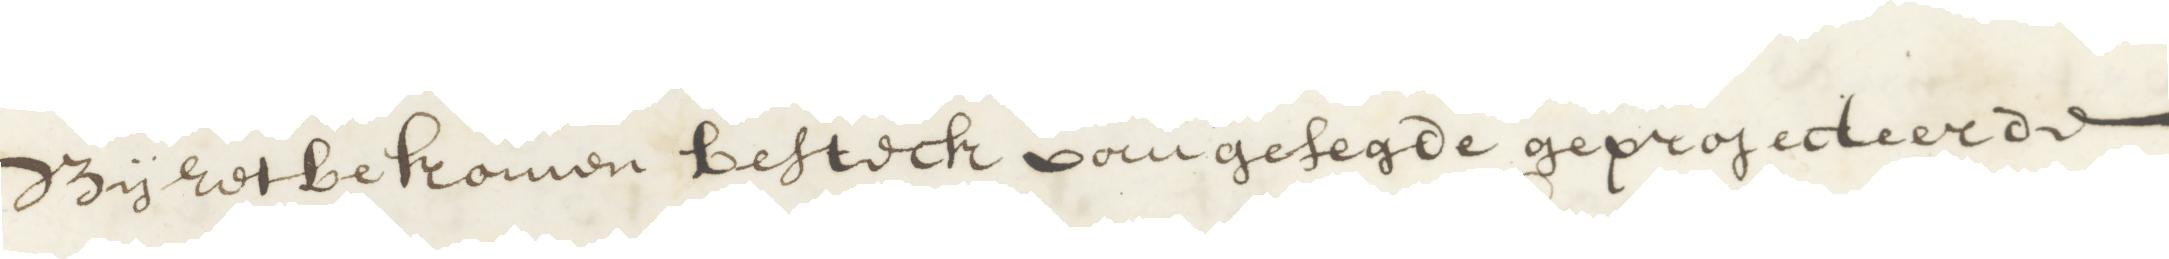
Bij het bekomen besteck van gesegde geprojecteerde
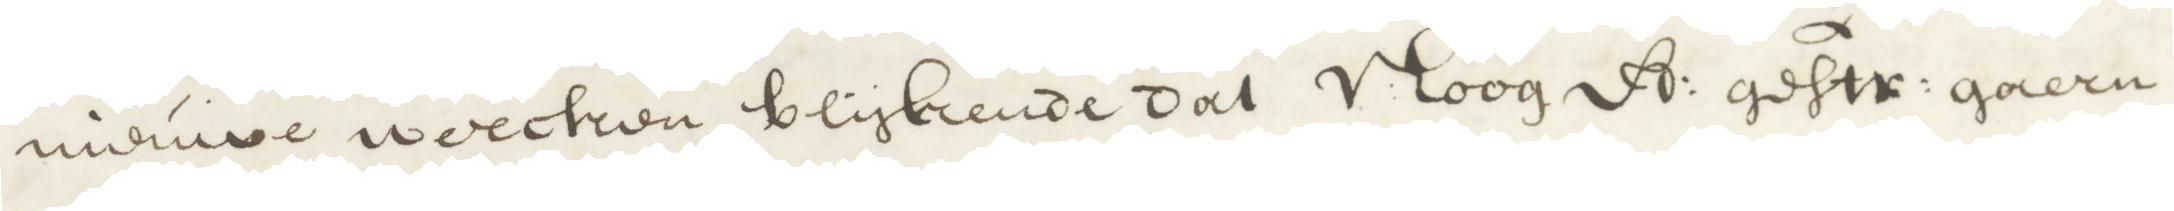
nieuwe wercken, blijkende dat V: hoog Ed: gestr: gaern
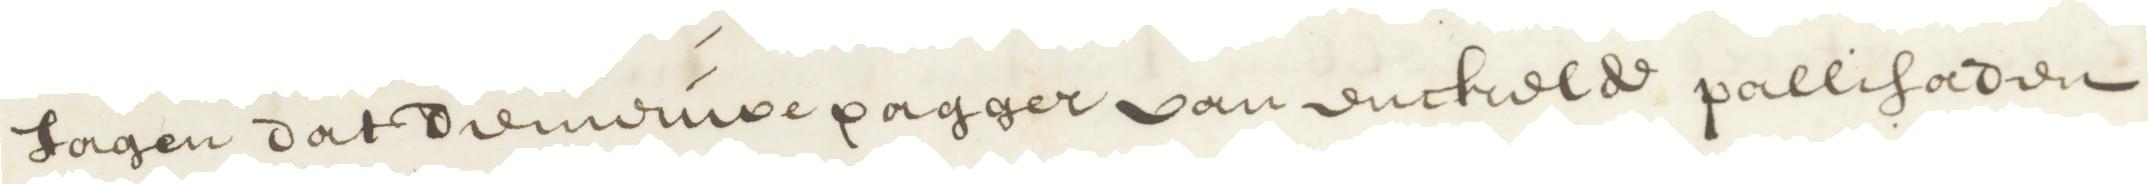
sagen dat de nieuwe pagger van enckelde pallisaden
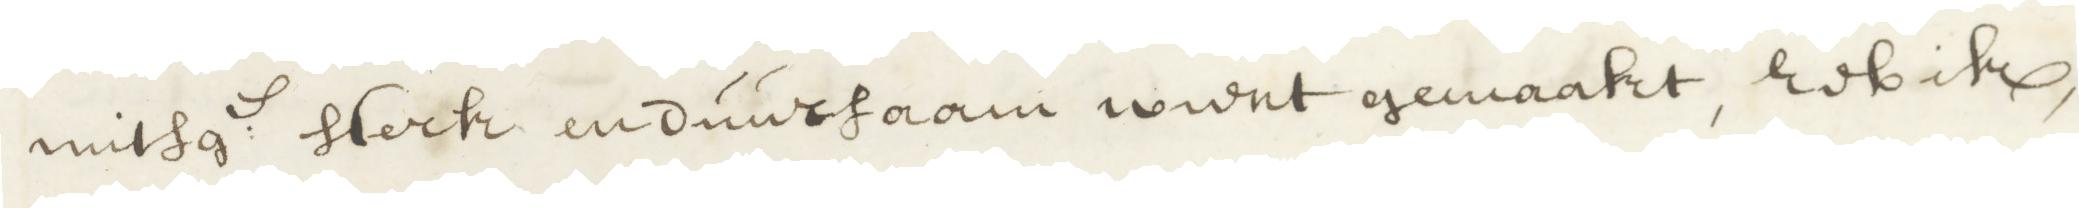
mitsg:s sterk en duursaam wiert gemaakt, heb ik,
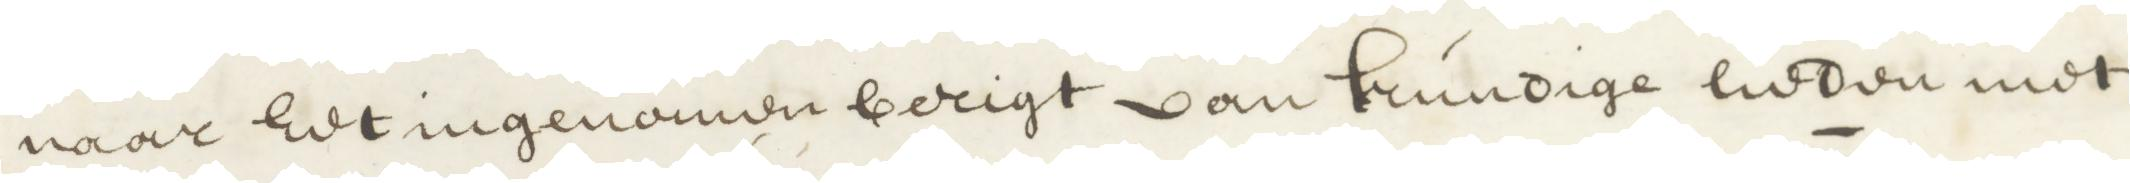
naar het ingenomen berigt van kundige lieden niet
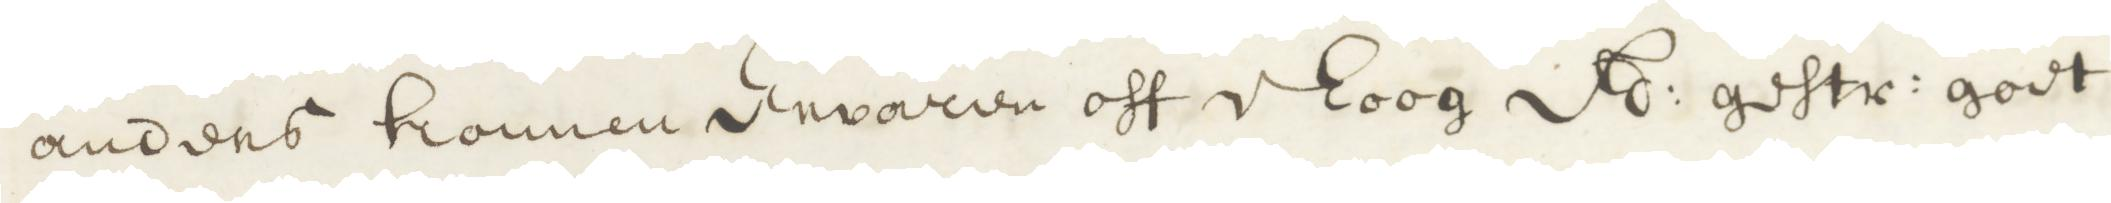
anders konnen Ervaren off V hoog Ed: gestr: goet
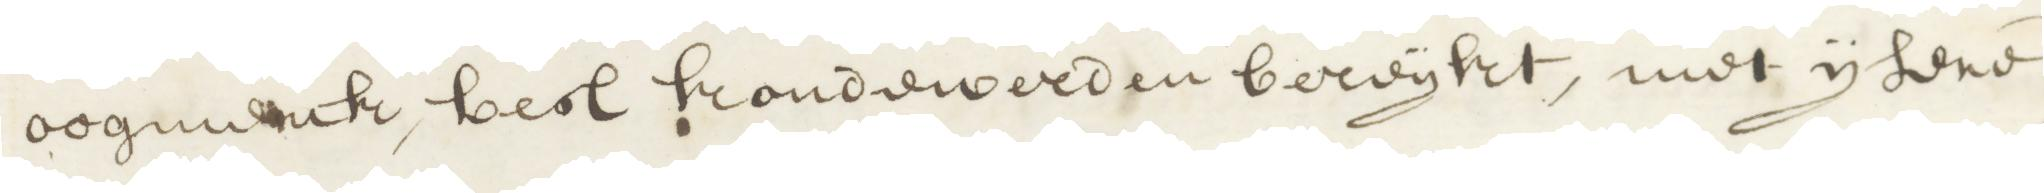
oogmerck, best konde werden bereijkt, met ijsere
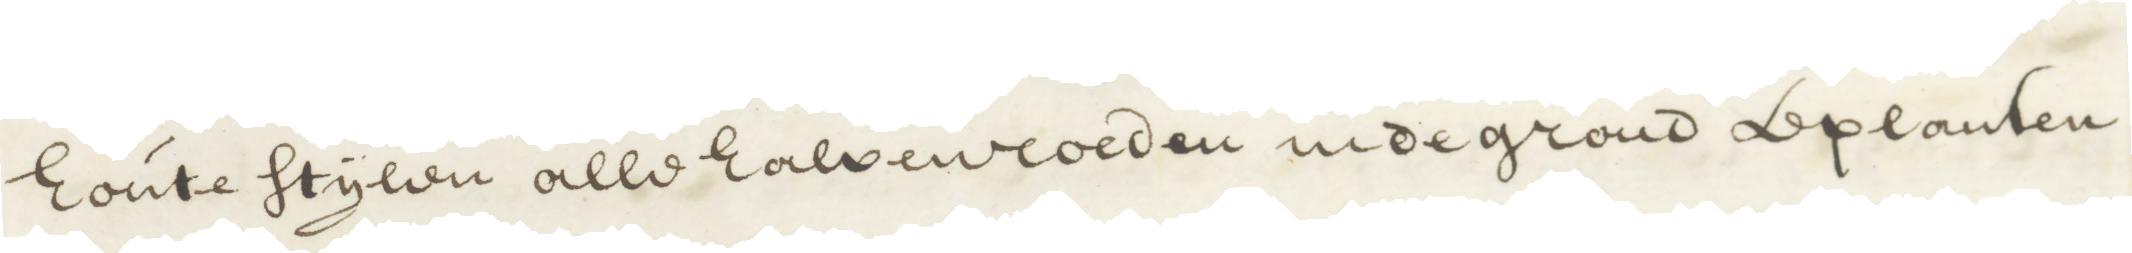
houte stijlen alle halvenroeden in de grond te planten
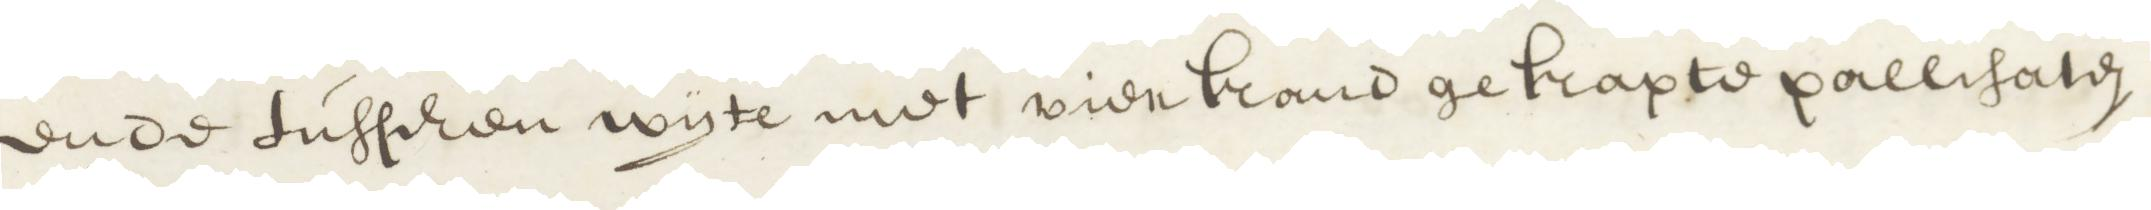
en de tusschen wijte met vierkand gekapte pallisaten
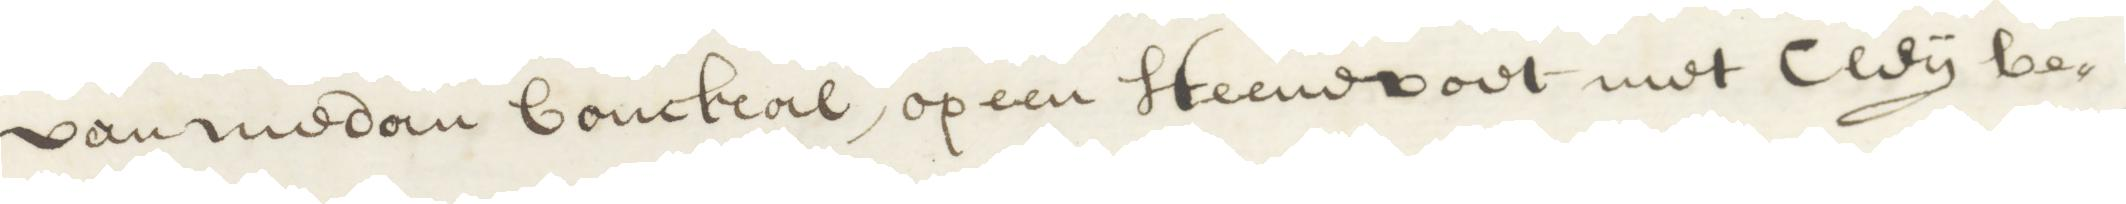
van medan bonckal, op een steenevoet met cleij be„
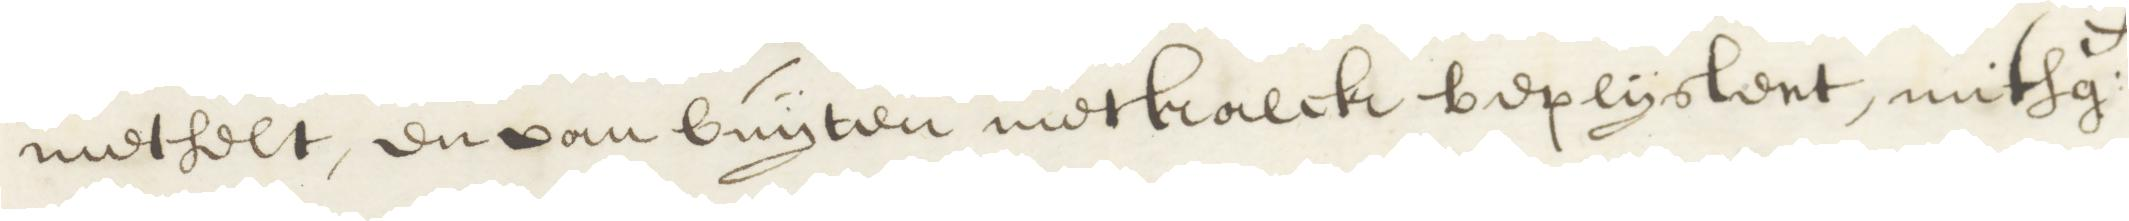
metselt, en van buijten met kalck beplijstert, mitsg:s
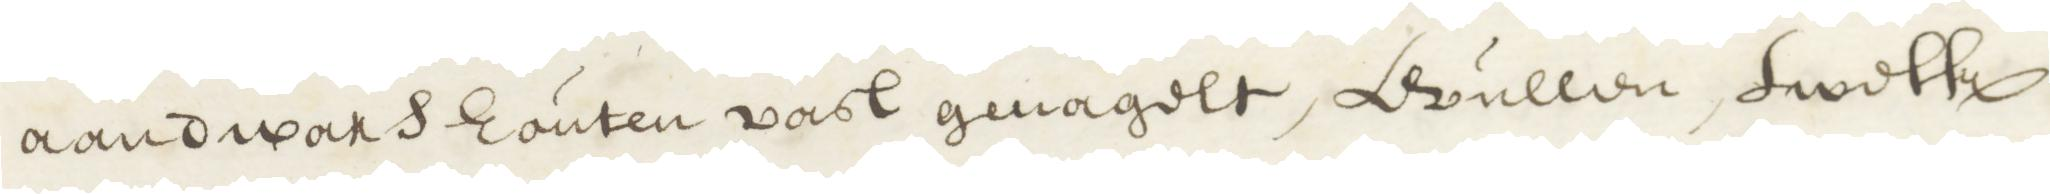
aan dwars houten vast genagelt, tevullen, twelk
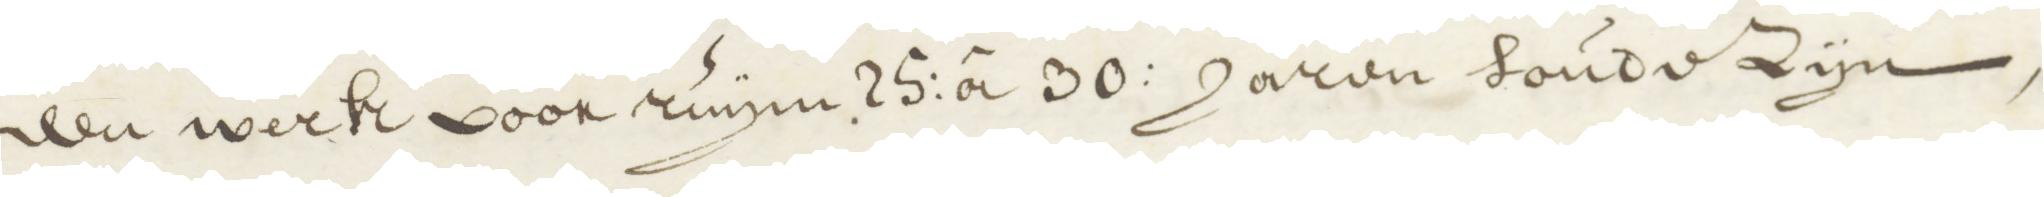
een werk voor ruijm 25: â 30: Jaren soude zijn
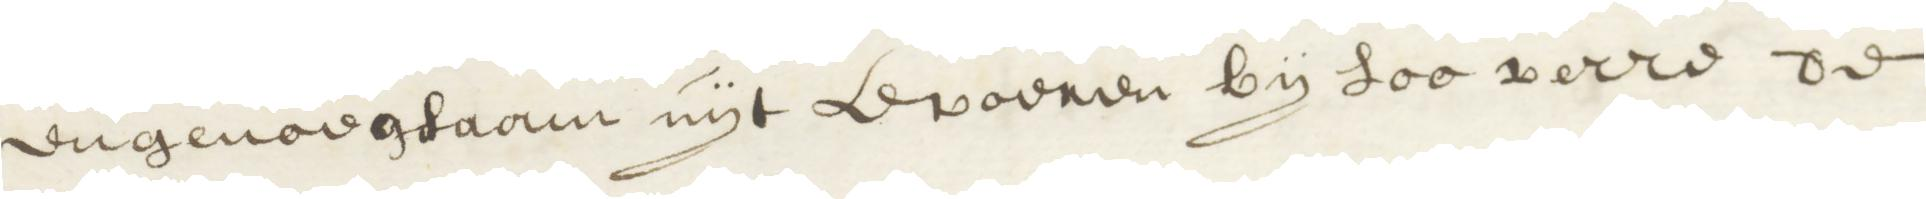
en genoegsaam uijt te voeren bij soo verre de
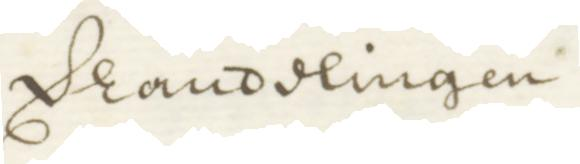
verhandelingen
